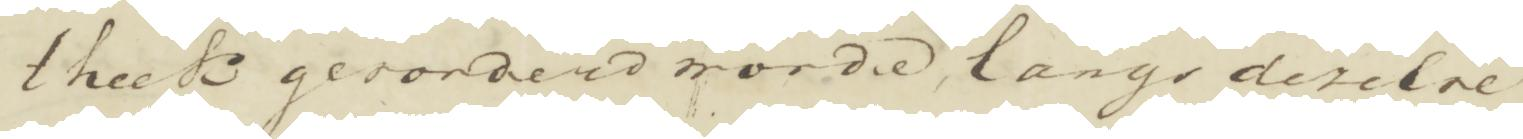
theek gevorderd worde, langs deselve
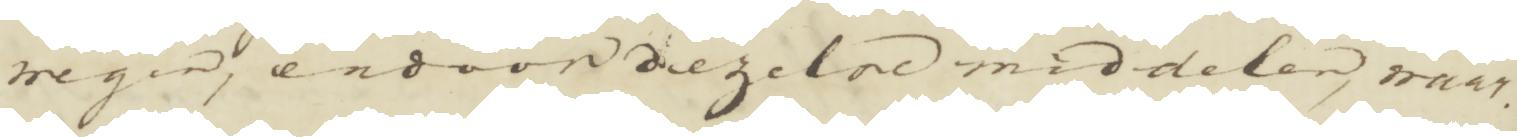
wegen, en door dezelve middelen, waar„
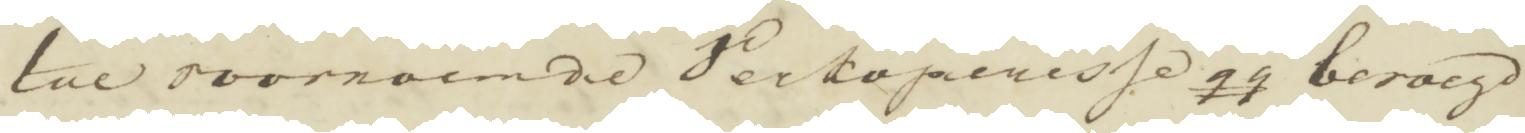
toe voornoemde Verkoperesse qq bevoegd
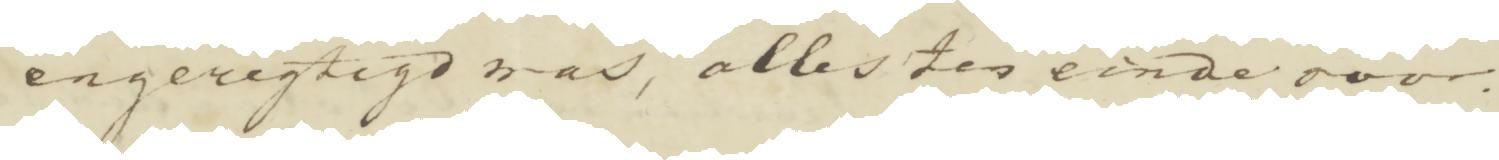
engeregtigd was, alles ten einde voor„
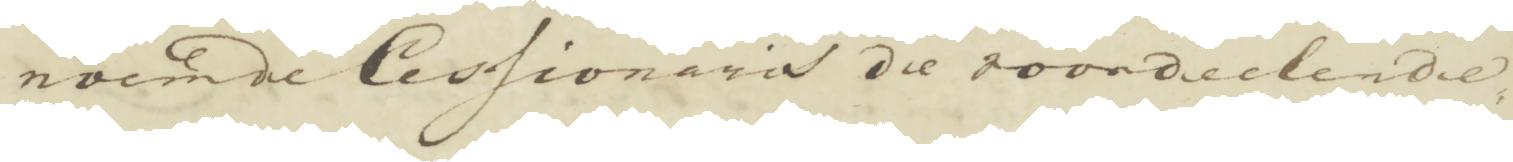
noemde Cessionaris die voordeelen de„
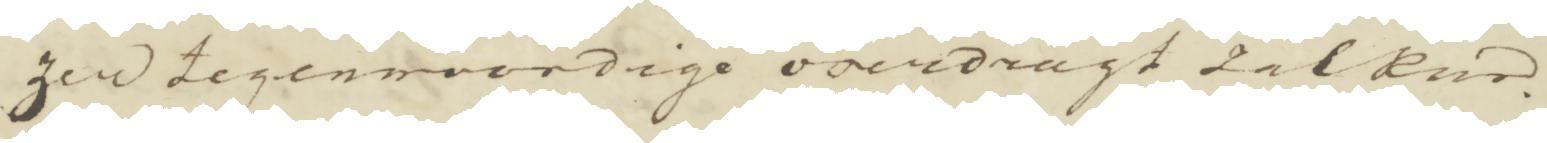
zer tegenwoordige voerdragt zal kun„
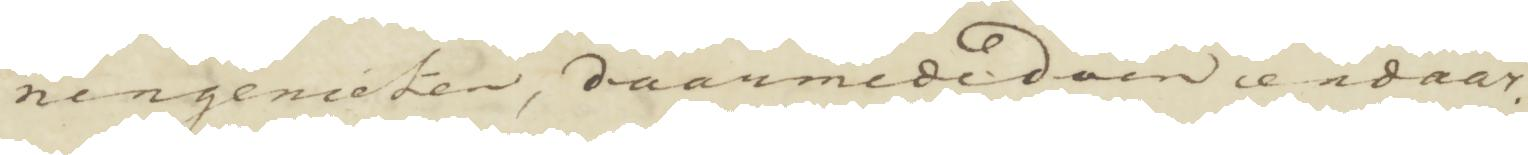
nen genieten, daarmede doen en daar„
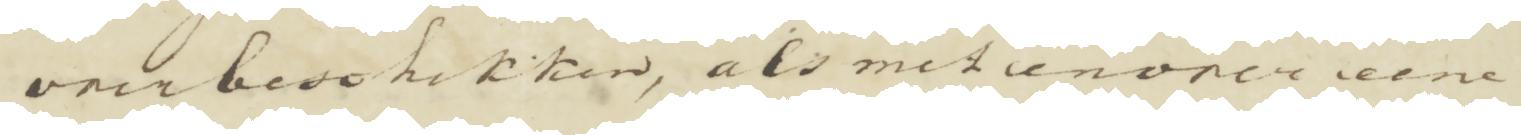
over beschikken, als met en over eene
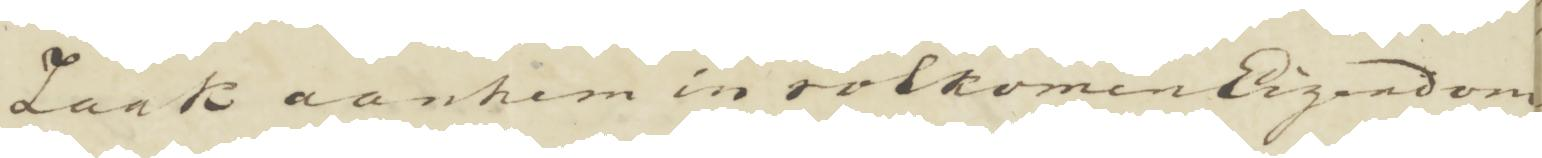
Zaak aan hem in volkomen Eizendom
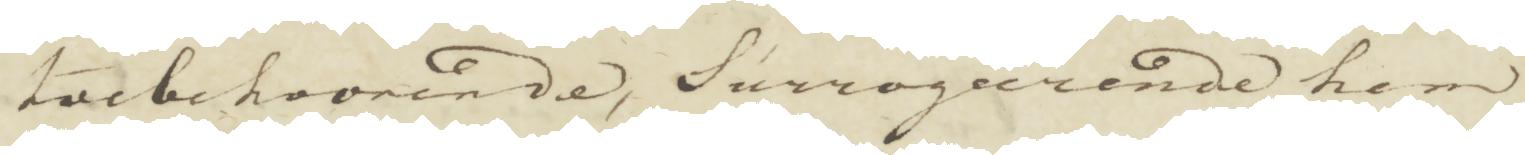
toebehoorende, Surrogeerende hem
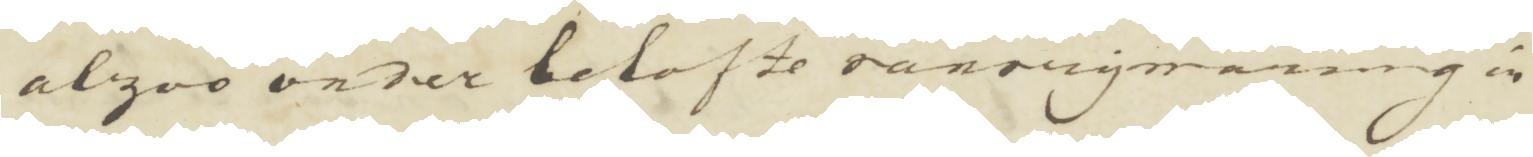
alzoo onder belofte van vrywaring in
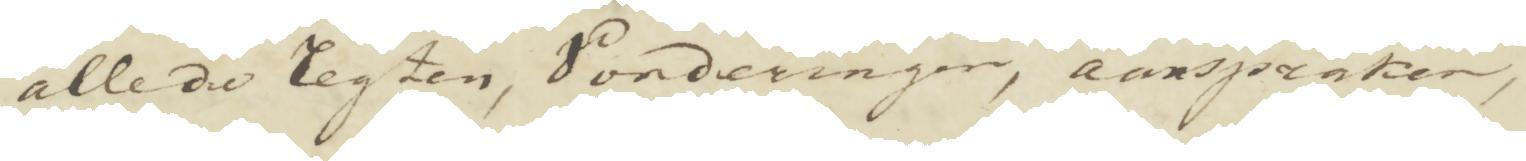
alle de regten, Vorderingen, aanspraken,
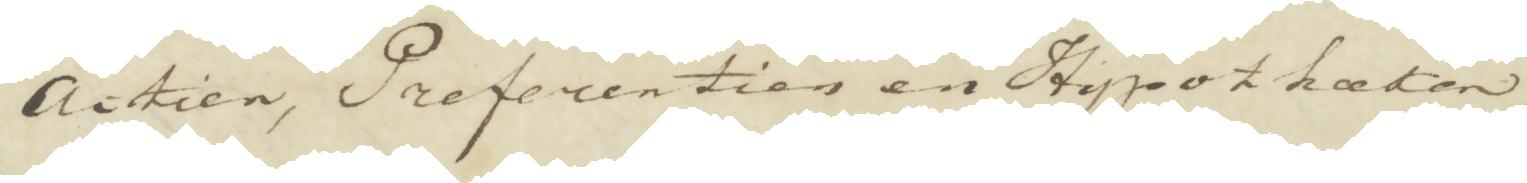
Actien, Preferentien en Hypotheeken,
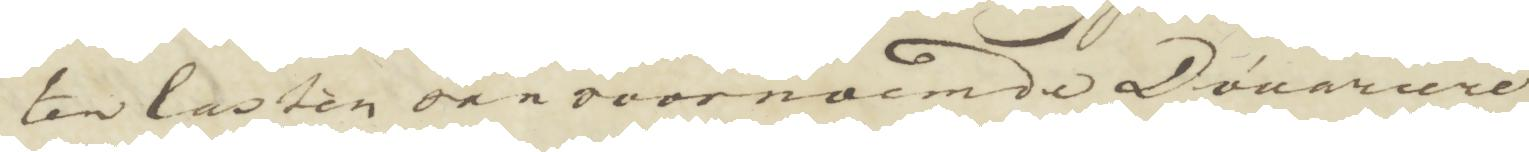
ten lasten van voornoemde Douariere
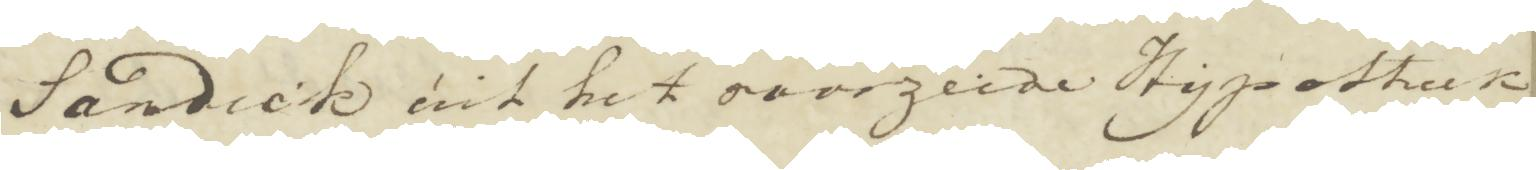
Sandick uit het voorzeide Hypotheek
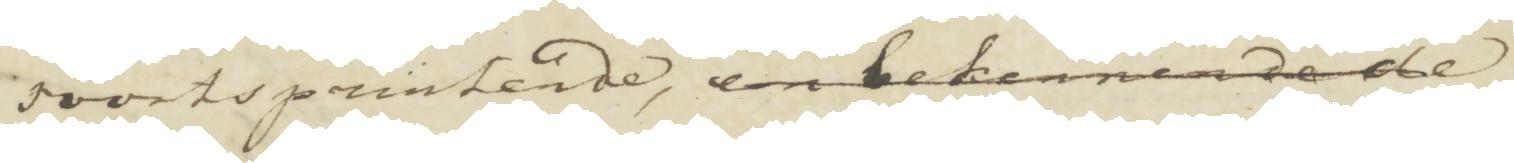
voortsprintende, en bekennende de
